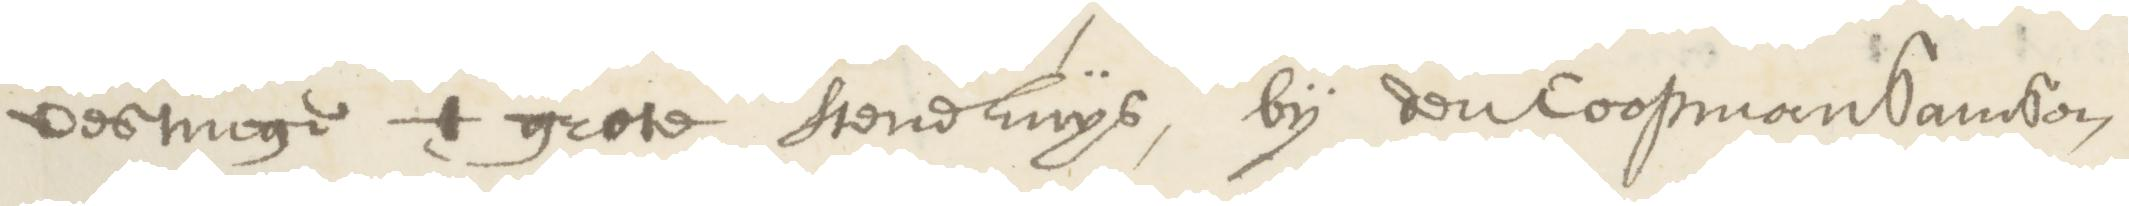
vestinge ’t grote stendhuijs, bij den CoopmanSamson
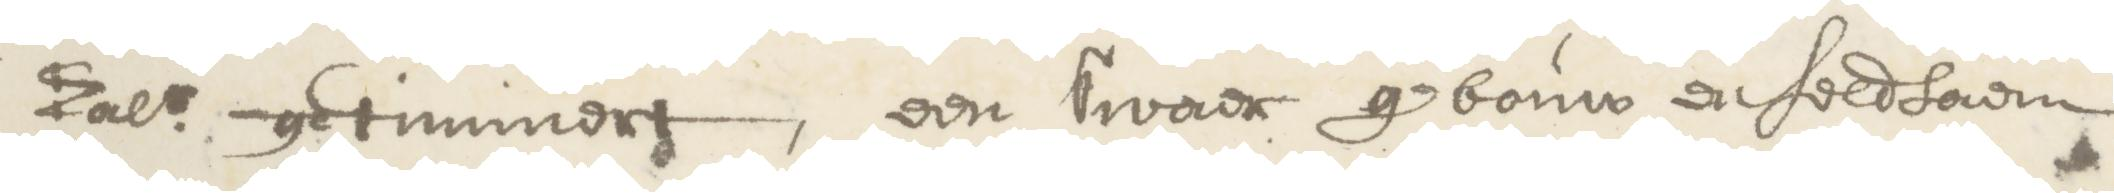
zal.r getimmert, een swaer gebouw en seldsaem
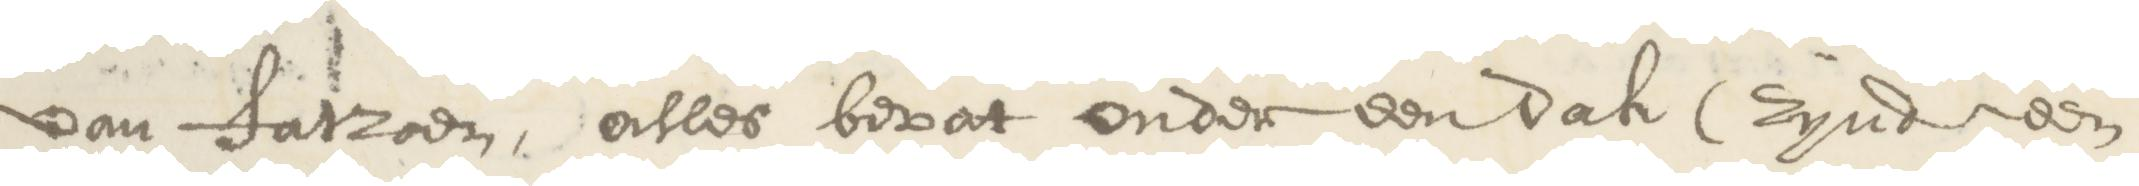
van fatzoen, alles bevat onder een dak (zijnde een
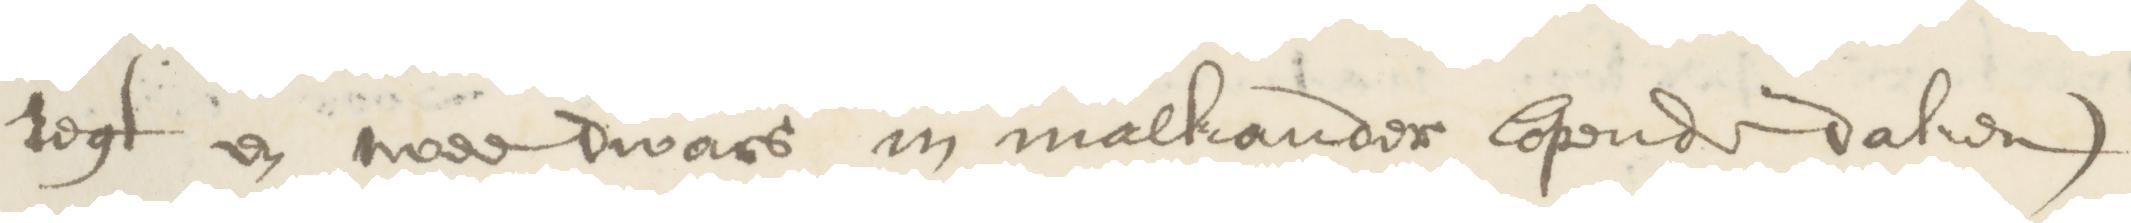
regt en twee dwars in malkander lopende daken)
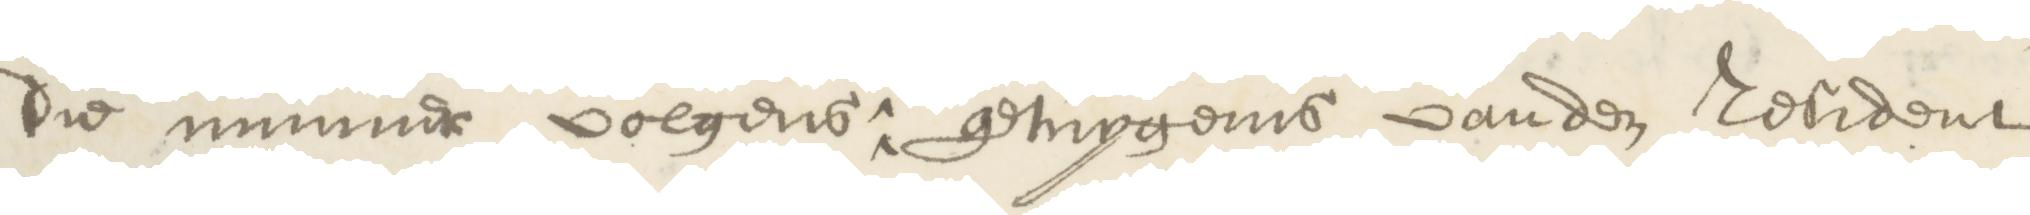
die nimmer volgens getuijgenis van den resident,
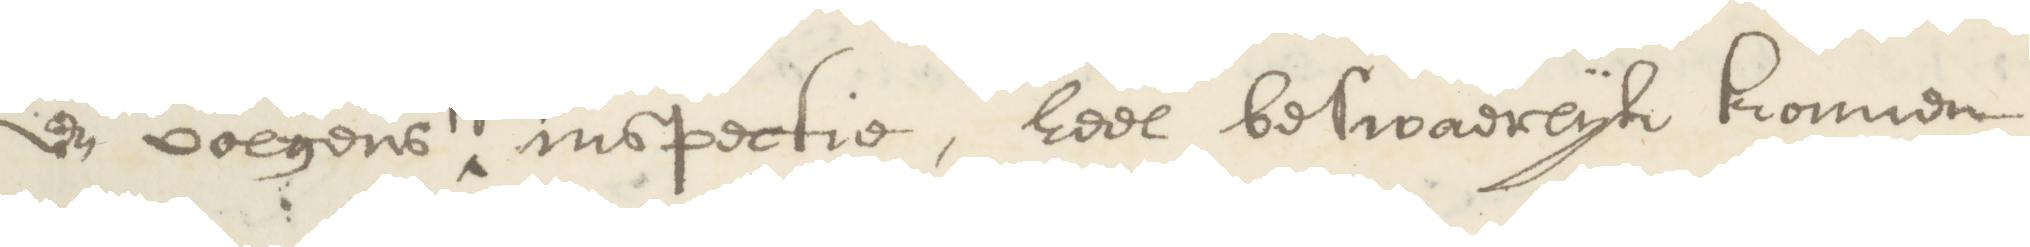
en volgens eijgen inspectie, heel beswaerlijk konnen
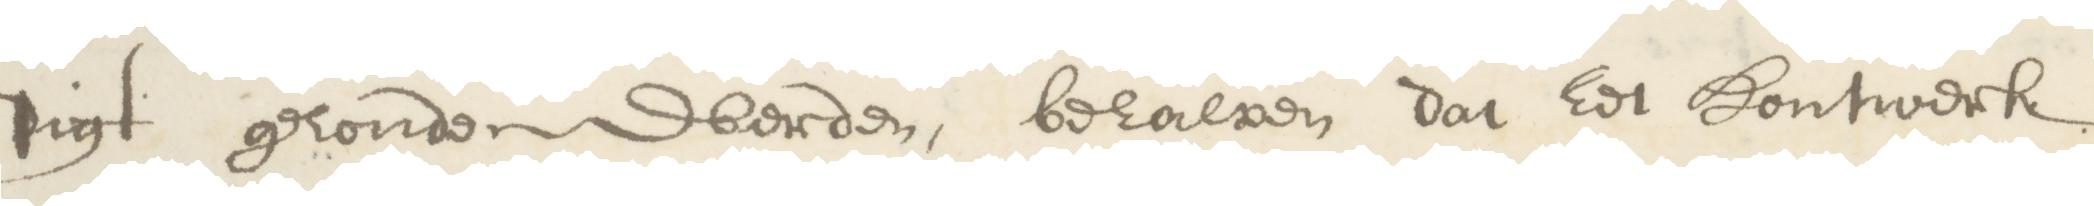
digt gehouden werden, behalven dat het Houtwerk
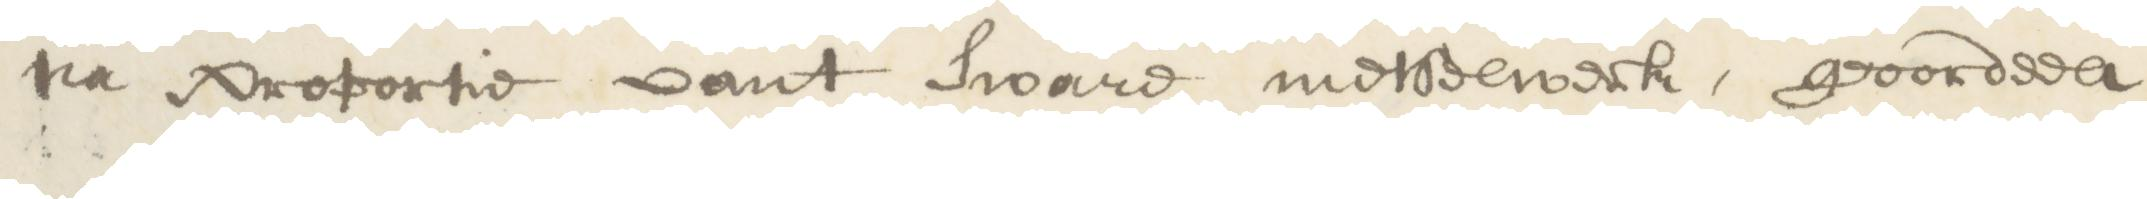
na proportie van't sware metselwerk, geoordeelt
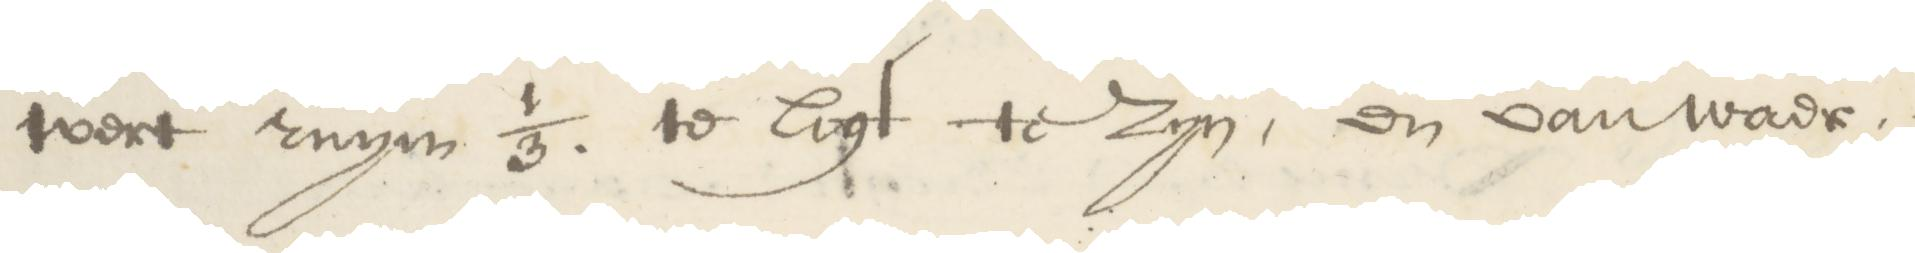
wert ruijm 1/3. te ligt te zijn, en van waer,
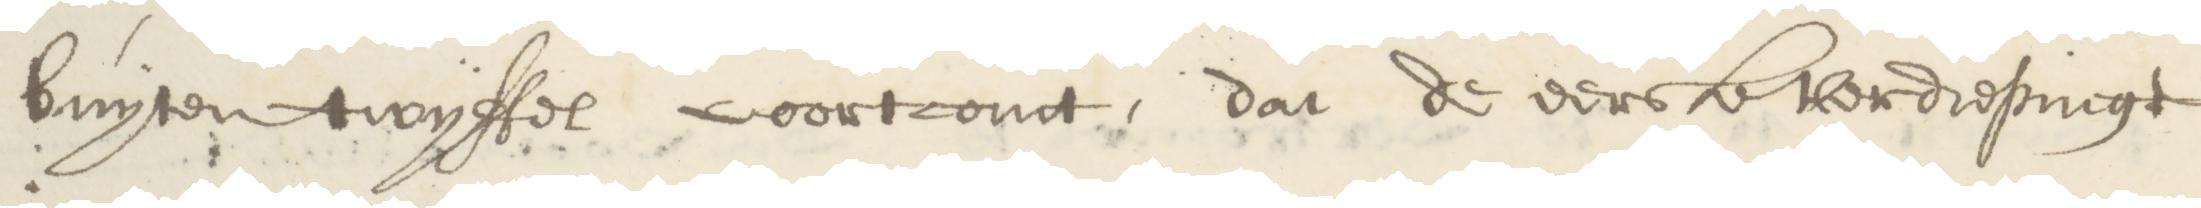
buijten twijffel voortcomt, dat de eerste verdiepingt
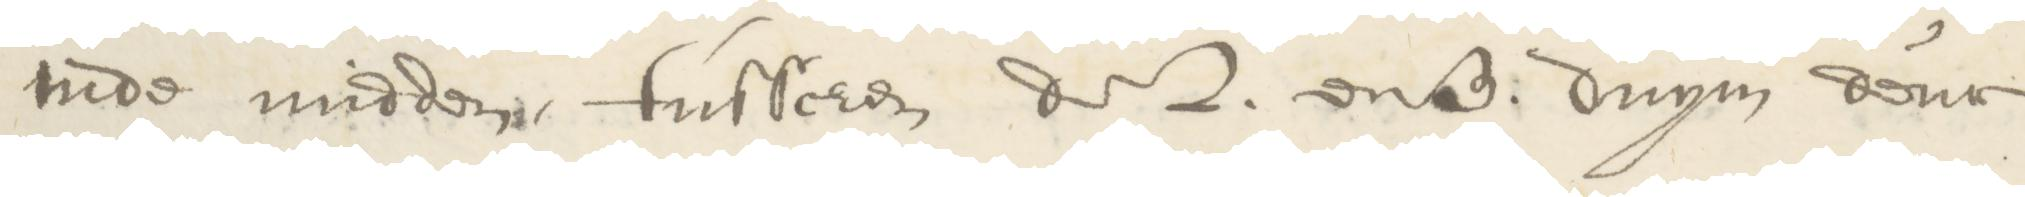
inde midden, tusschen de 2. en3. duijm deur
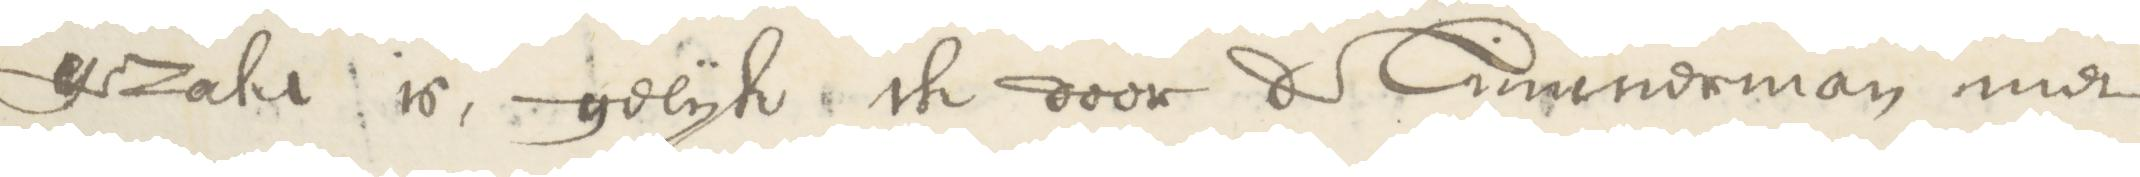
gezakt is, gelijk ik door de Timmerman met
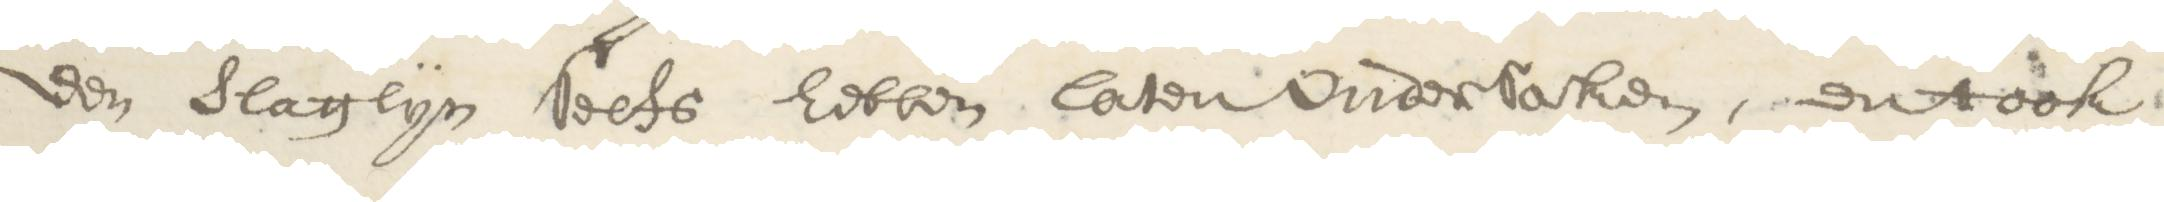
een slaglijn selfs hebben laten ondersoeken, en't ook
